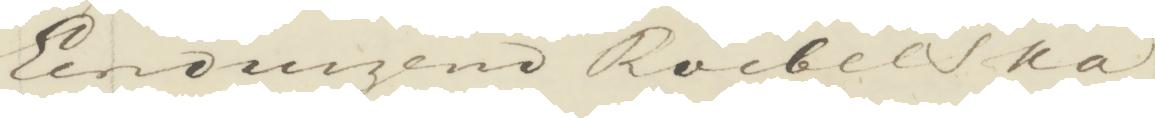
Een duizend Roebels ka
